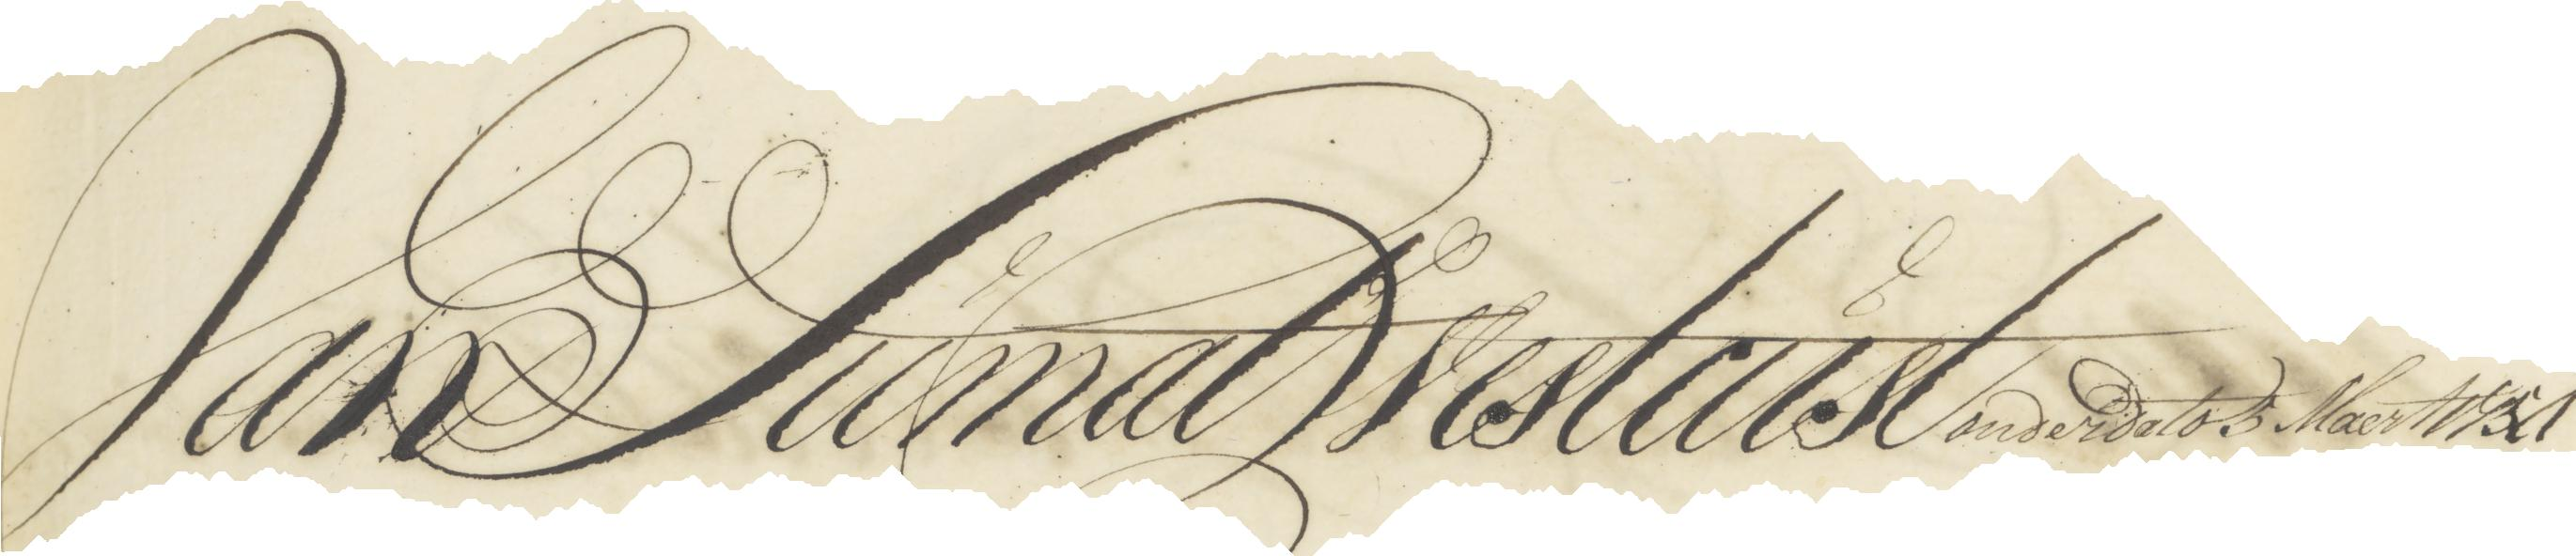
Van Sumat:s westcust onderdato 5 Maert1754
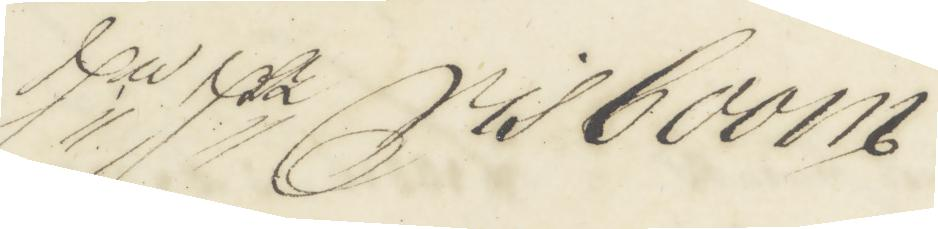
J„w J„sz visboom
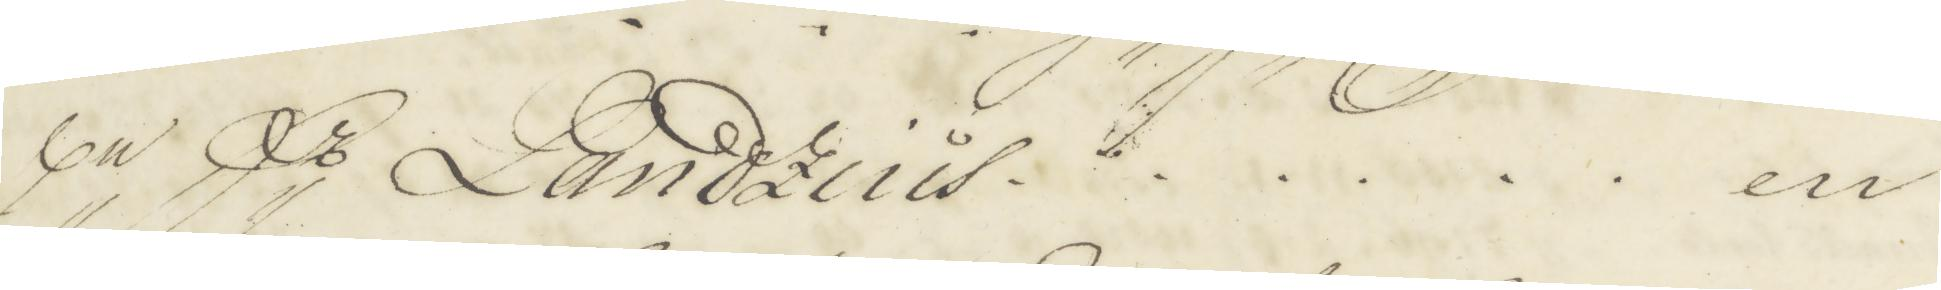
p„r p„r Landzius . . . . . . en
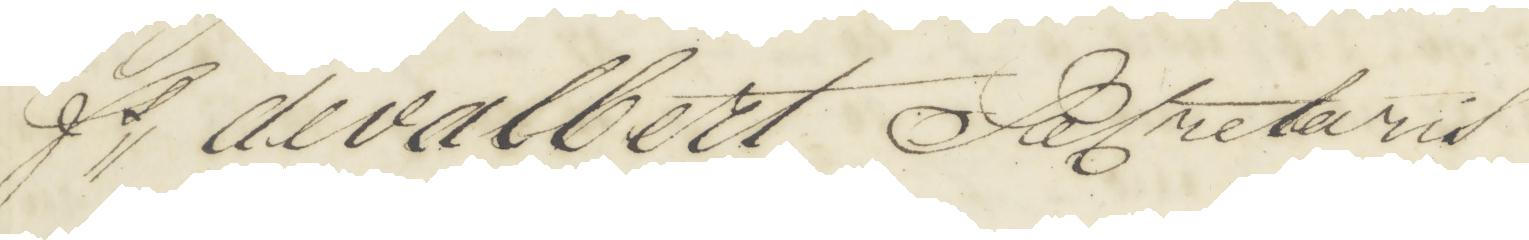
f„s devalbert Secretaris
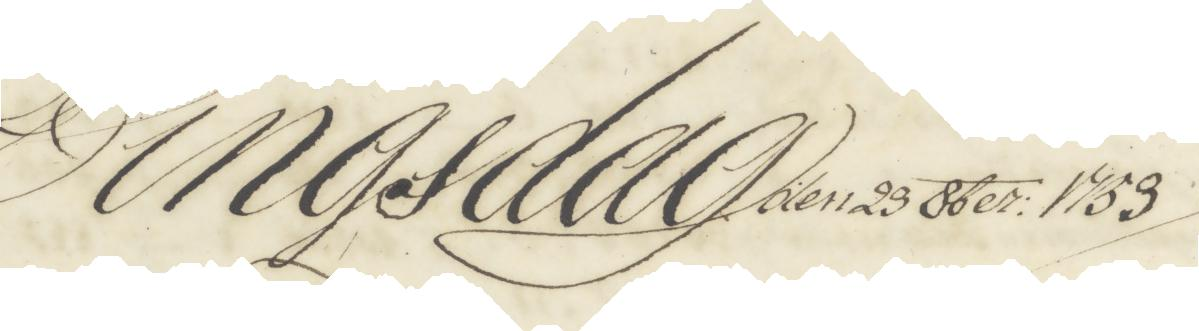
Dingsdag den 23 8ber: 1753
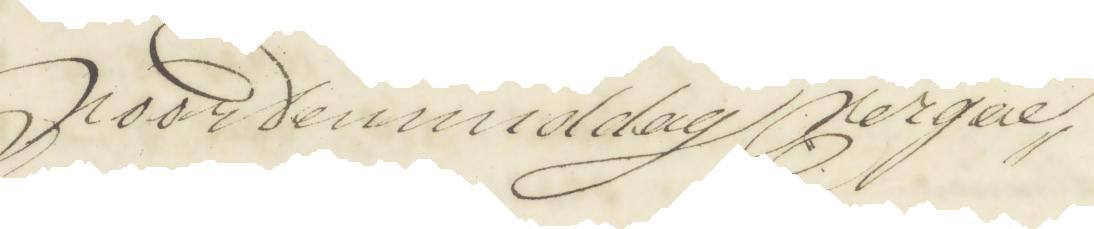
voordenmiddag vergae„
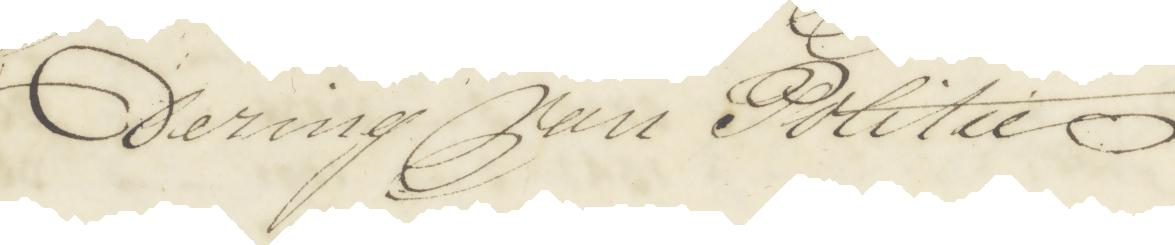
dering van Politie
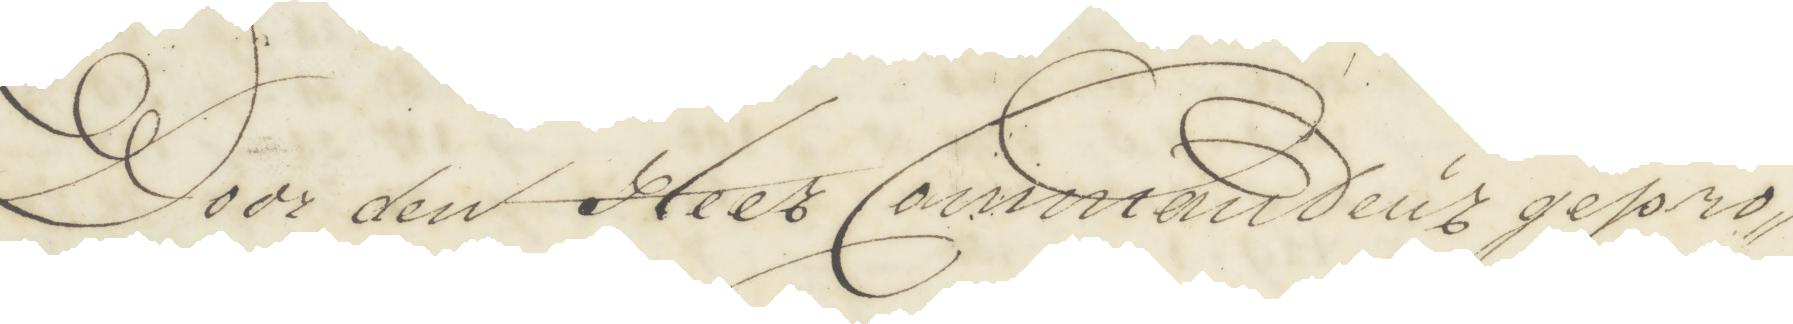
Door den Heer Commandeur gepro„
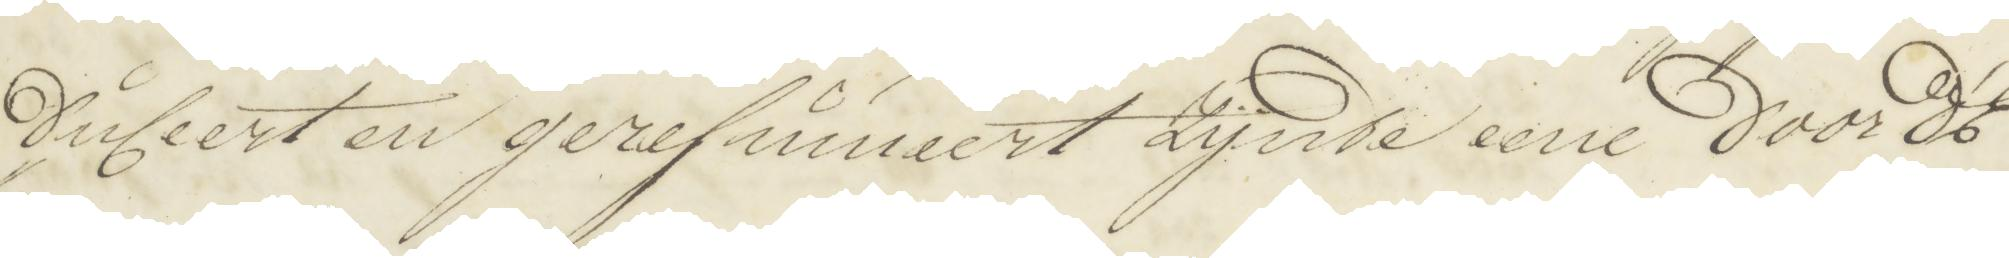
„duceert en geresumeert zijnde eene door d'E
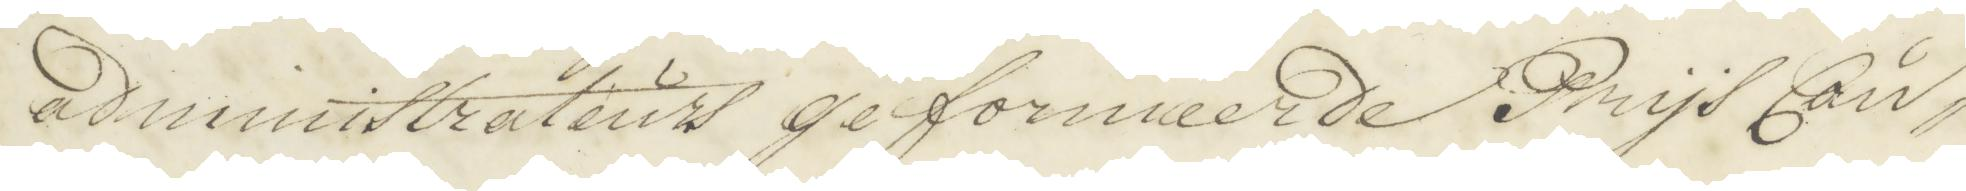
administrateurs geformeerde Prijs Cou„
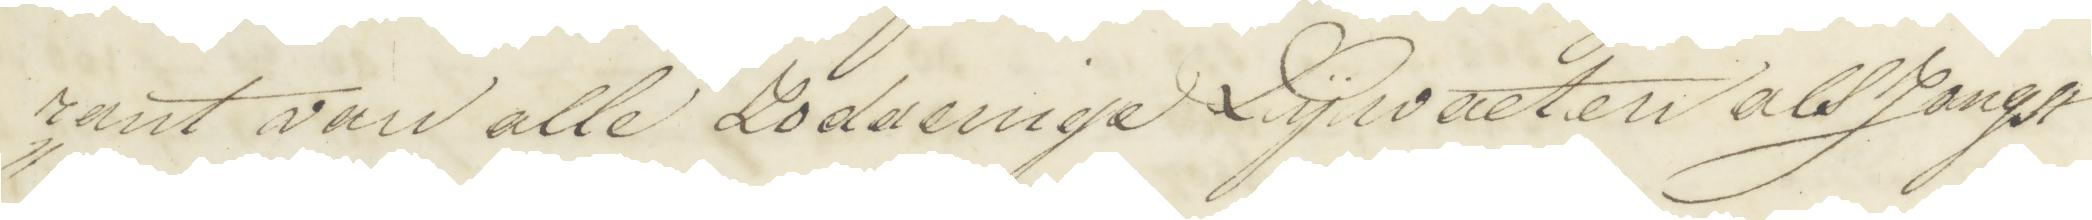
„rant van alle zodaenige Lijwaeten als Jongst
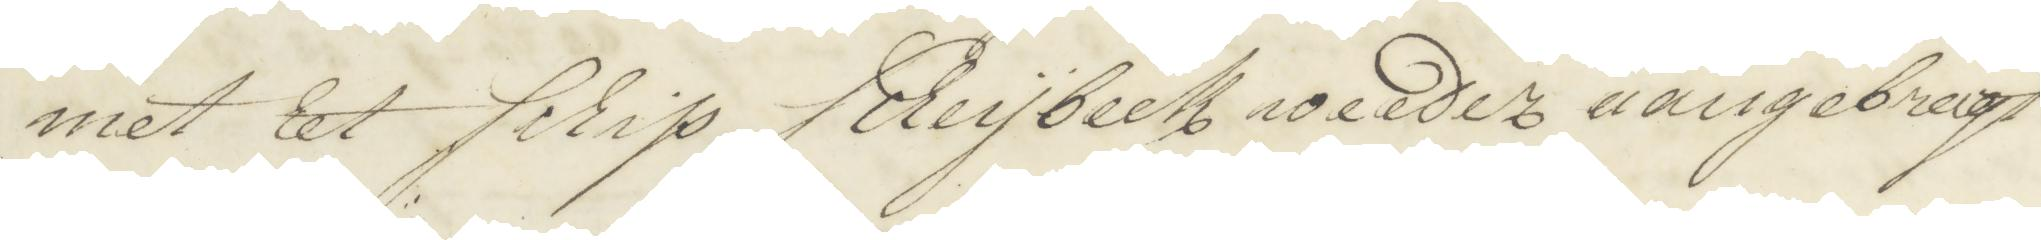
met het schip Scheijbeek weeder aangebragd
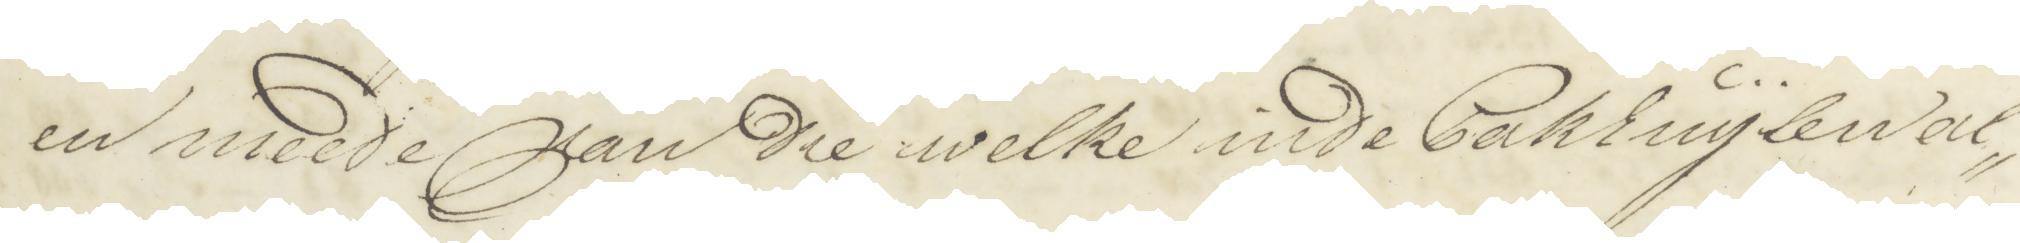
en meede van die welke inde Pakhuijsen al„
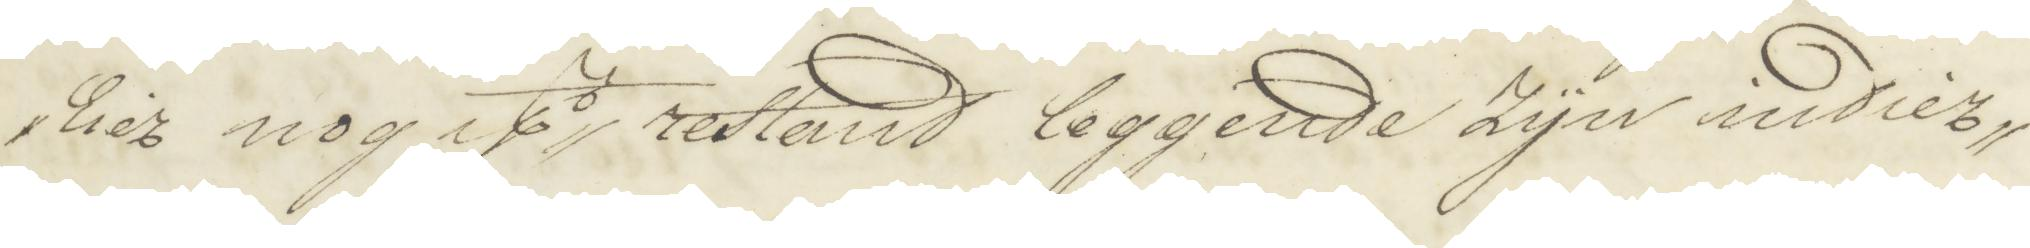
„ hier nog p:s restand leggende zijn in dier„
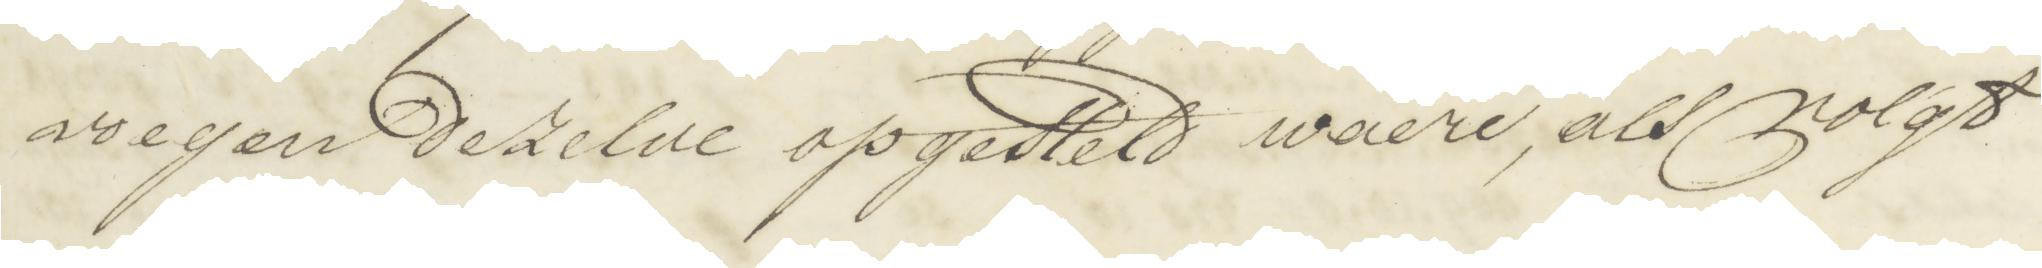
voegen dezelve op gesteld waere, als volgt
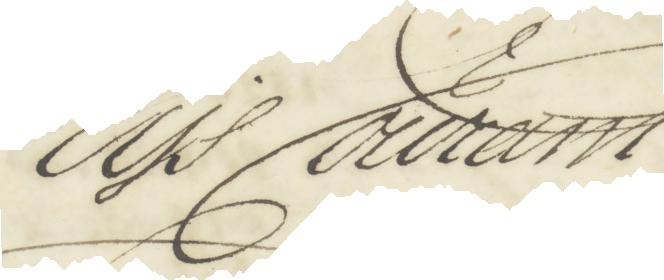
Prijs Courant
